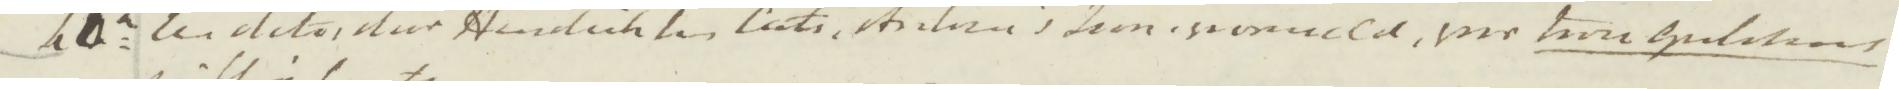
46:a Een dito, door Hendrik ten Cate, Antoni's Zoon, voormeld, voor twee Guldens
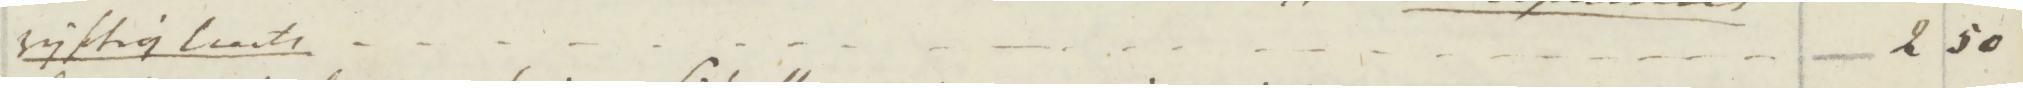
Vijftig Cents- - - - - - - - - - - - - - - - - - - - - - - - - - - - - - - - - - - - - - - - - - - - - - — 2 50
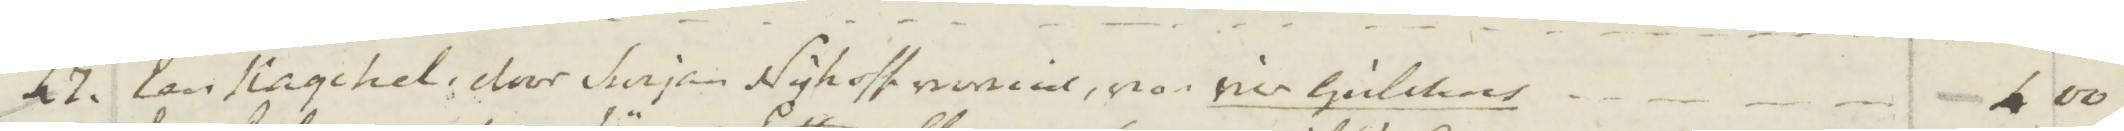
47. Een Kagchel, door Iurjan Nijhoff voorzeid, voor vier Guldens - - - - - - - 4 00
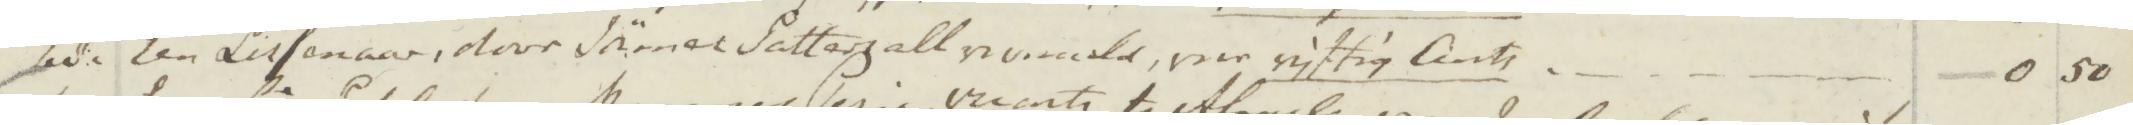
48. Een Lessenaar, door Jämer Fattervall voormeld, voor vijftig Cents - - - —0 50
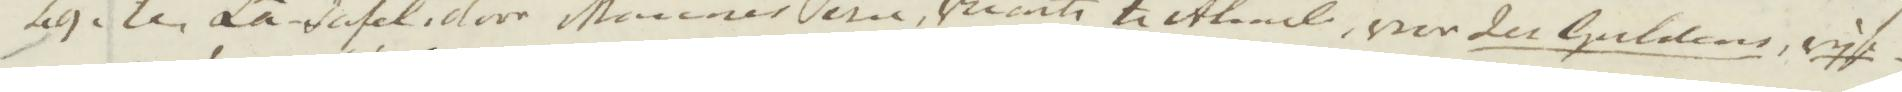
49. Een La-Tafel, door Mannes Pesie, veearts te Almelo, voor Zes Guldens, vijf-
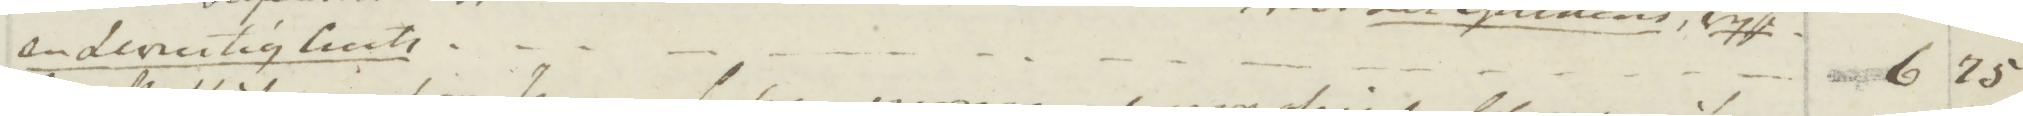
en Zeventig Cents - - - - - - - - - - - - - - - - - - - - - - - - - - - - - - - - - - - - - - - - - - 6 75
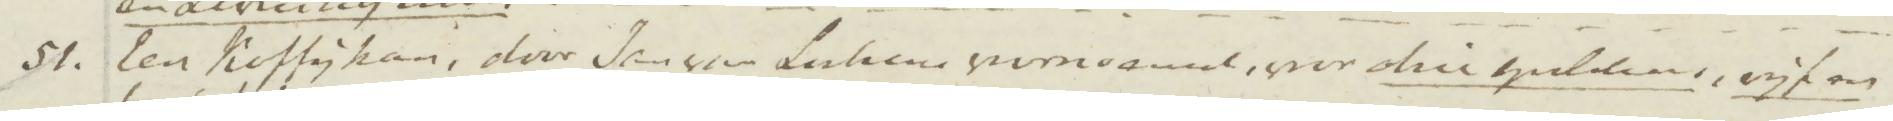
51. Een Koffijkan, door Jan van Lutum voornoemd, voor drie guldens, vijf en
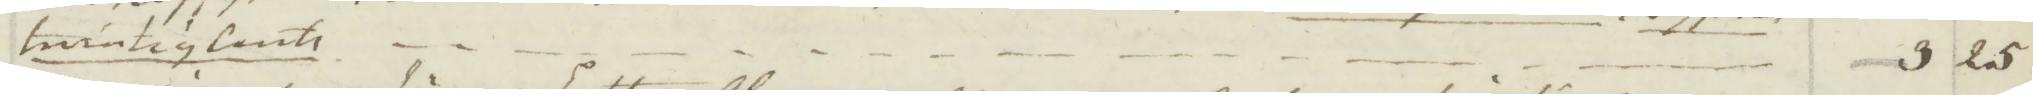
twintig Cents - - - - - - - - - - - - - - - - - - - - - - - - - - - - - - - - - - - - - - - - - - —3 25
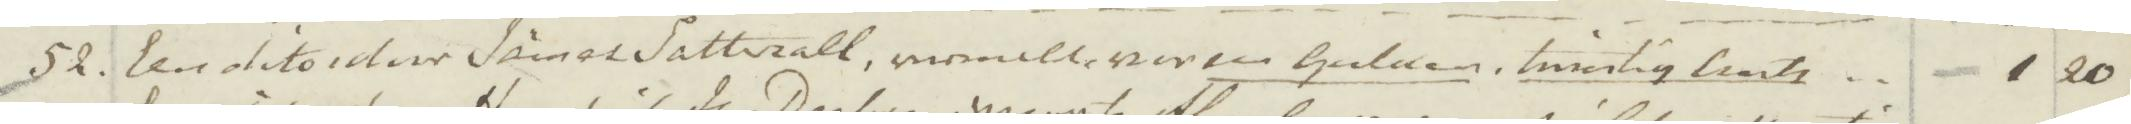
52. Een dito, door Jämes Fatterzall, voormeld vooreen Gulden. twintig Cents-- —1 20
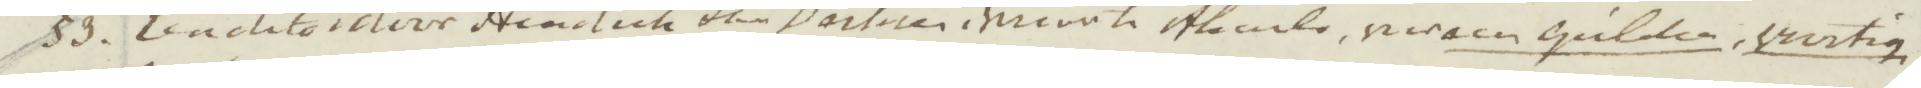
53. Een dito door Hendrik Jan Derksen woon te Almelo voor een Gulden, veertig
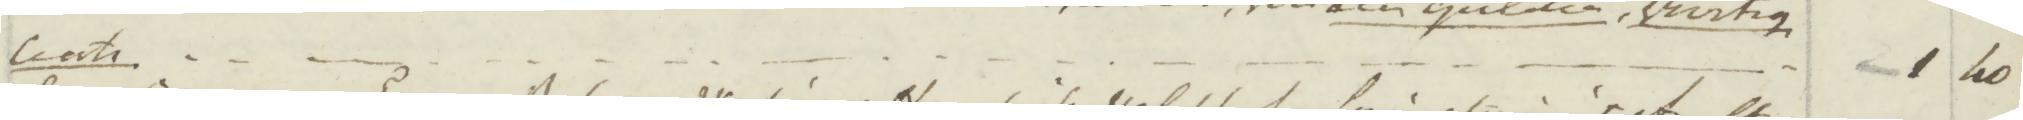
Cents - - - - - - - - - - - - - - - - - - - - - - - - - - - - - - - - - - - - - - - - - - - - - - - - - - —1 40
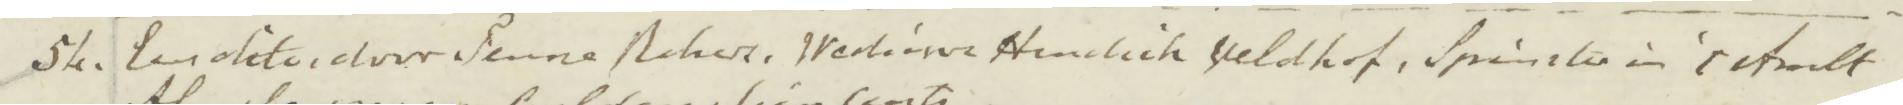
54. Een dito, door Fenne Rekers, Weduwe Hendrik Veldhof, Spinster in Ambt
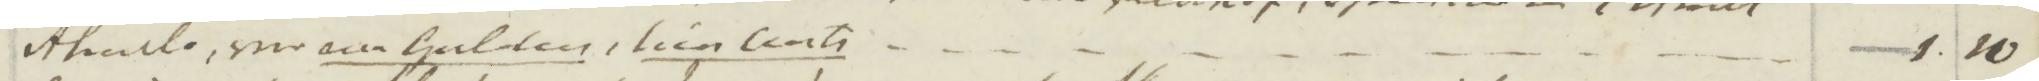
Almelo, voor een Guldens tien Cents- - - - - - - - - - - - - - - - - - - - - - — 1. 10
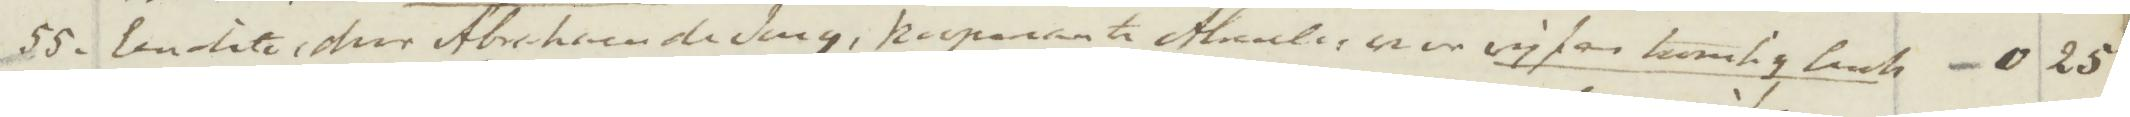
55. Een dito idoor Abraham de Iong, Koopman te Almelo voor vijf en twintig Cents — 0 25
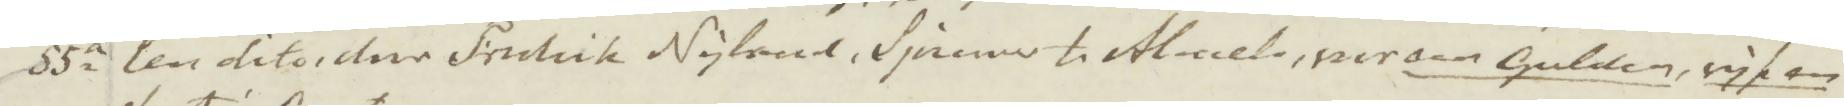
55=a Een dito, door Fredrik Nijland, Sjouwer te Almelo, voor een Gulden, vijf en
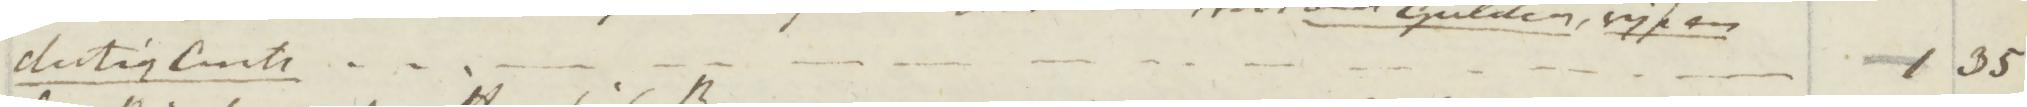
dertig Cents- - - - - - - - - - - - - - - - - - - - - - - - - - - - - - - - - - - - - - - - -- —1 35
